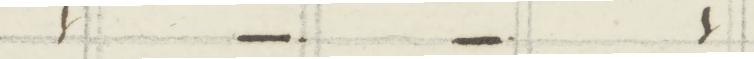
1 —. —. 1
